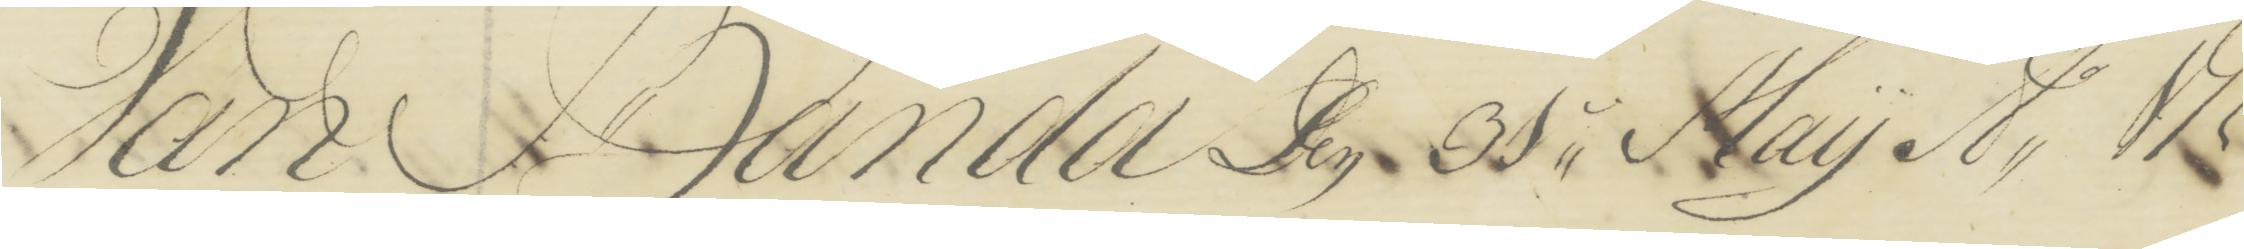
Van Banda Den 31„' Maij A„o 1756
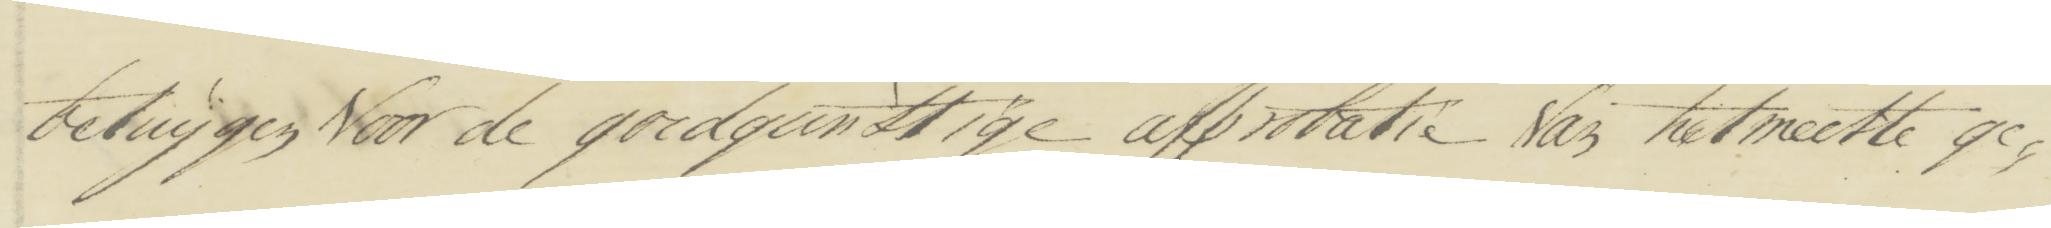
betuijgen voor de goedgunstige approbatie van hetmeeste ge„
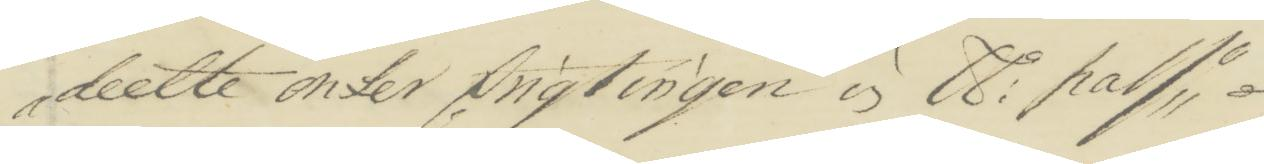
„deelte onser Verrigtingen in A:o pass„o
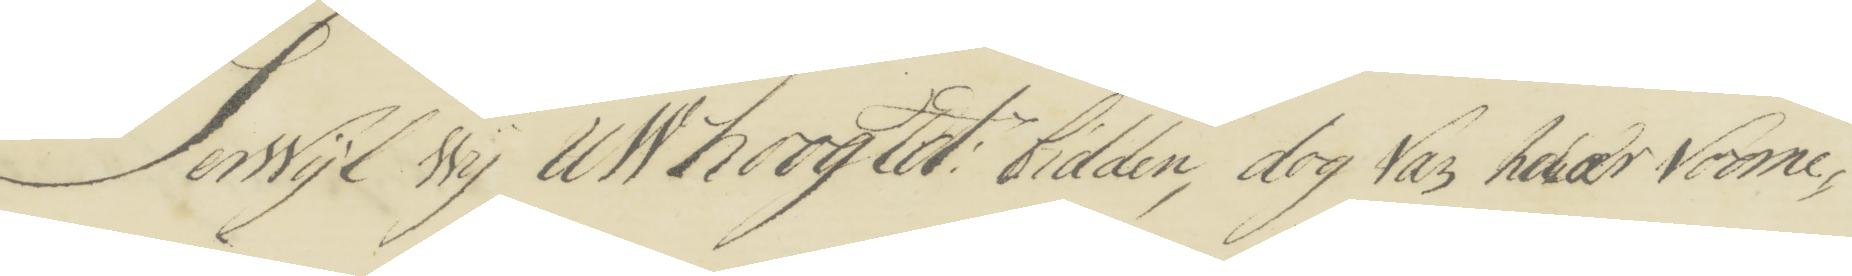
Terwijl wij uw hoog Ed:s bidden, dog van haar Voorne„
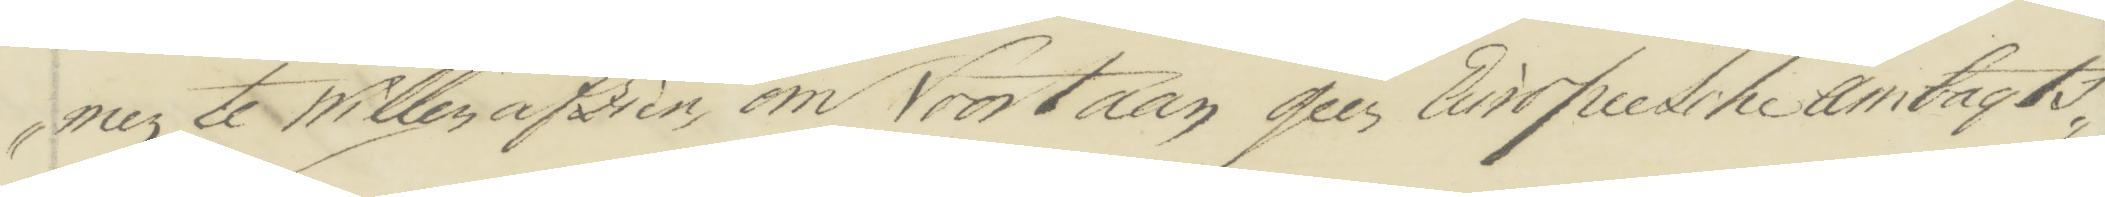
„men te willen afzien, om voortaan geen Europeesche ambagts„
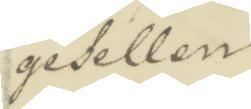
gesellen
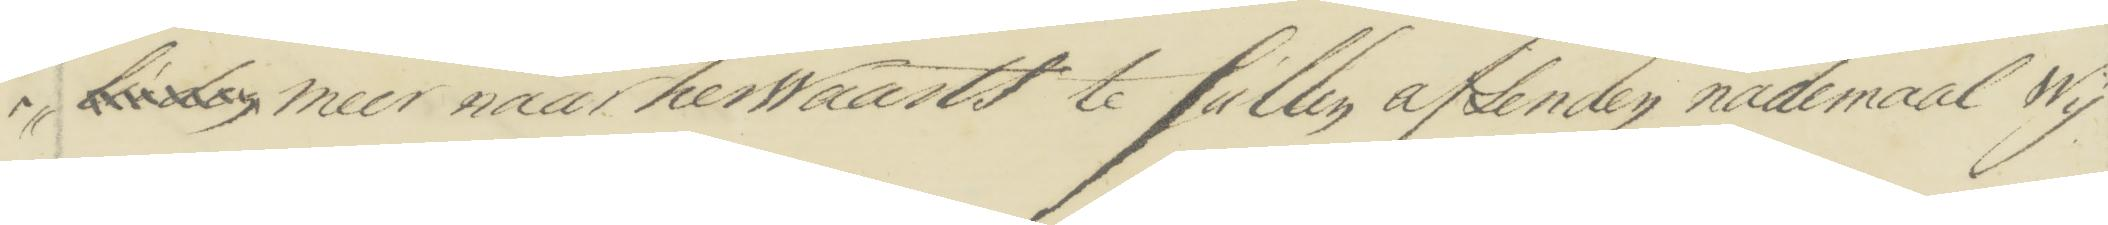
^„lieden meer naar herwaarts te sullen afsenden nademaal wij
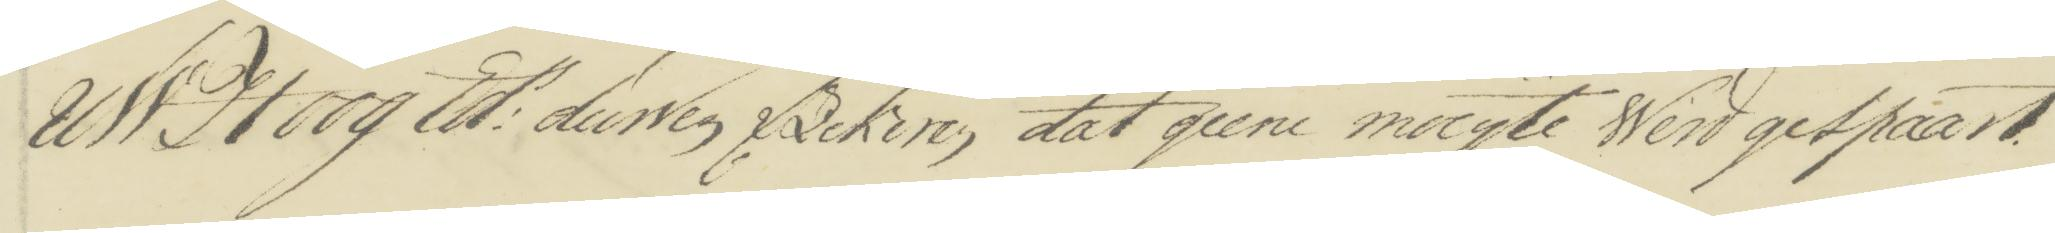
uw Hoog Ed:s durven verzekeren dat geene moeyte werd gespaart.
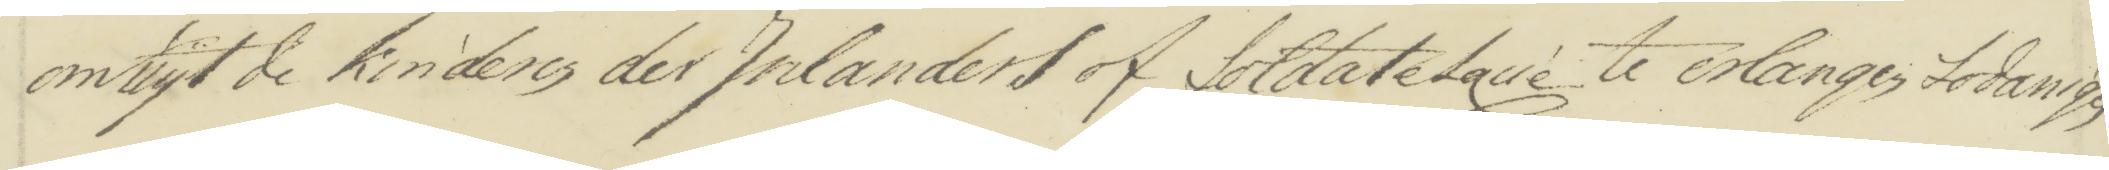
om uijt de kinderen der Jnlanders of soldatesque te erlangen sodanigen
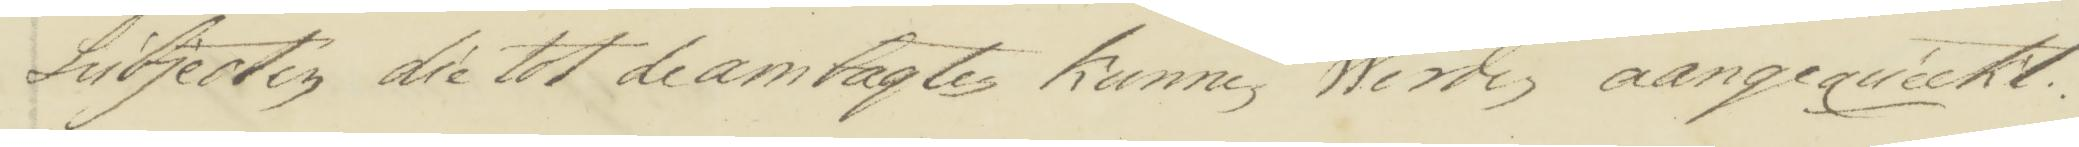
subjecten die tot de ambagten kunnen werden aangequeekt.
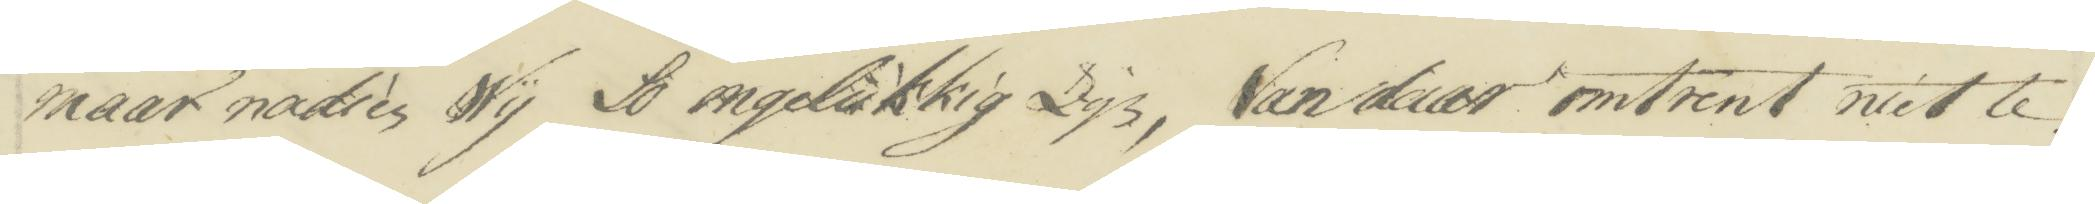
maar nadien wij so ongelukkig zijn, van daar omtrent niet te
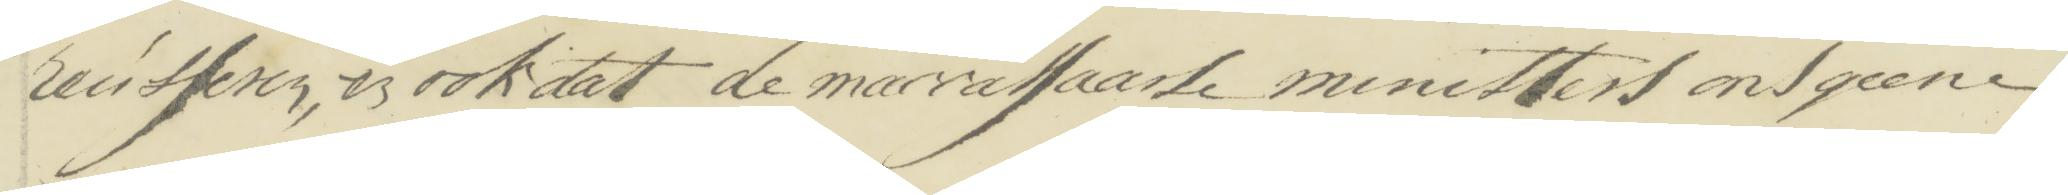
reusseren, en ook dat de maccassaarse ministers ons geene
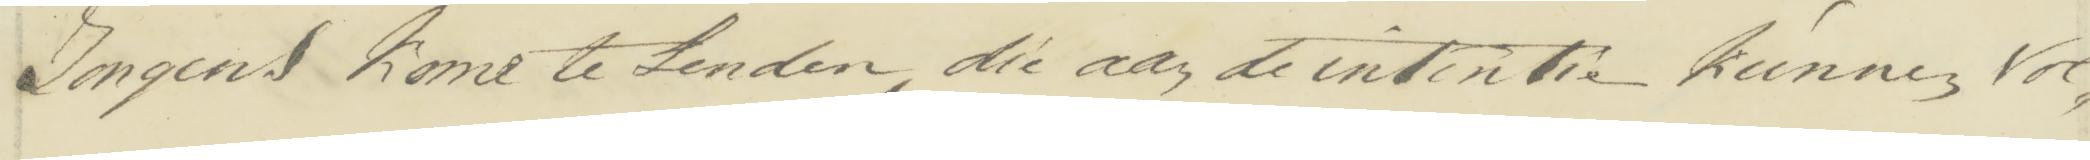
Iongens kome te senden, die aan de intentie kunnen vol„
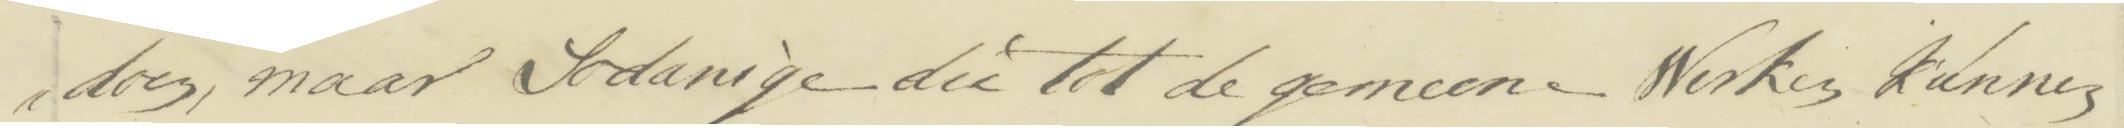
„doen, maar sodanige die tot de gemeene werken kunnen
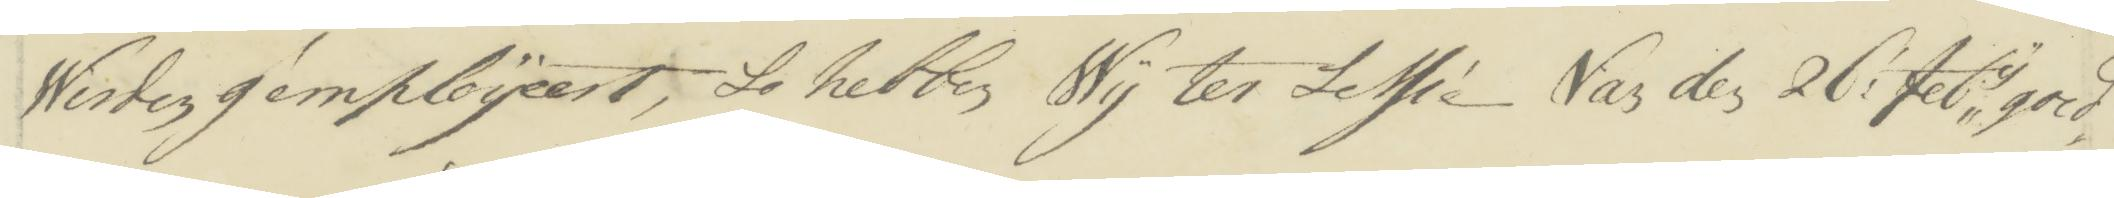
werden g’emploijeert, so hebben wij ter sessie van den 26:' feb„ij goed„
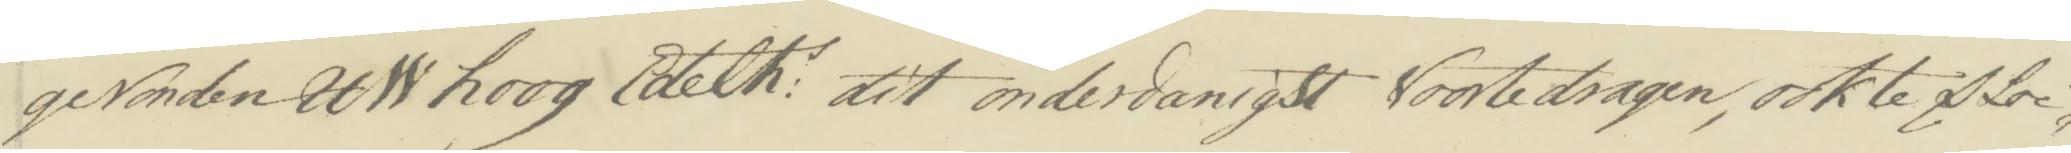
gevonden uw hoog Edelh: dit onderdanigst voortedragen, ook te versoe
